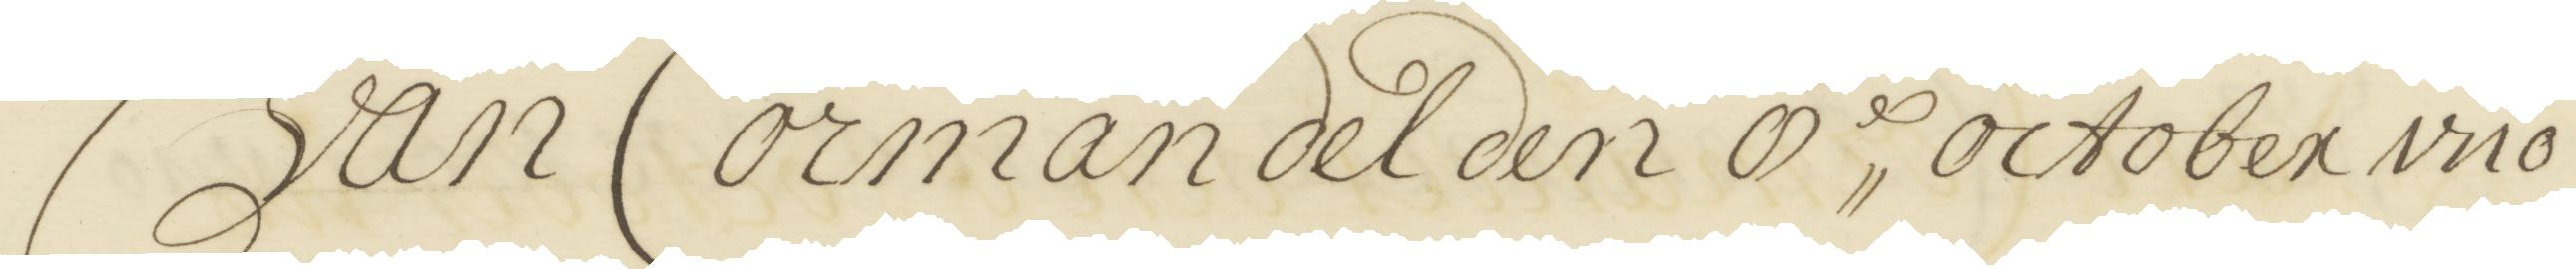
Van Corman del den 8„e october 1710
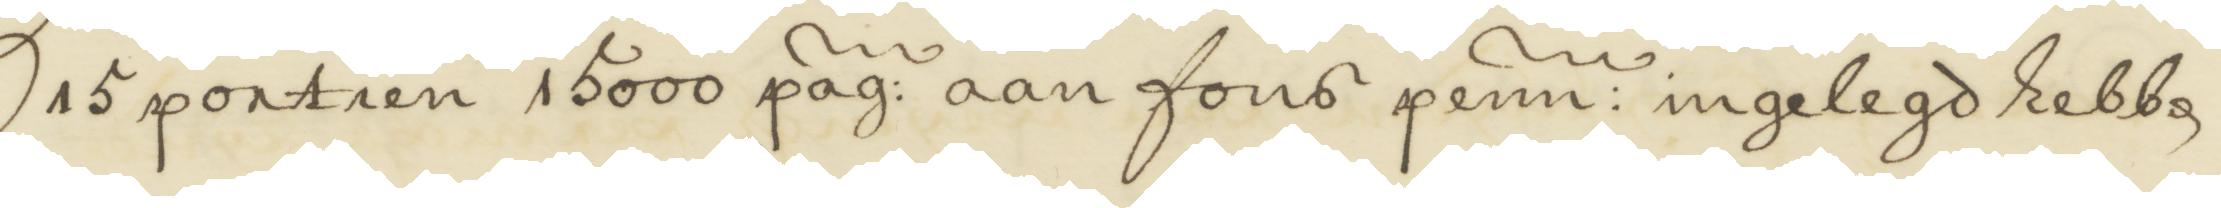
15 portien 15000 pag: aan fons penn: ingelegd hebben
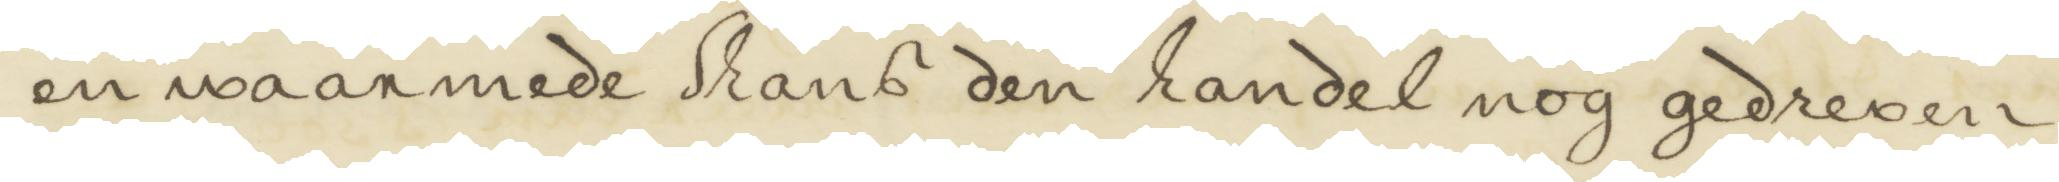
en waarmede thans den handel nog gedreven
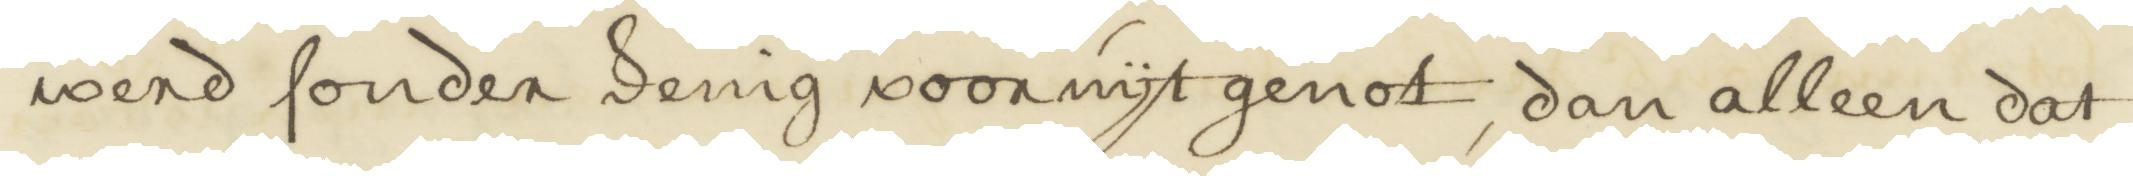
werd sonder Eenig vooruijtgenot, dan alleen dat
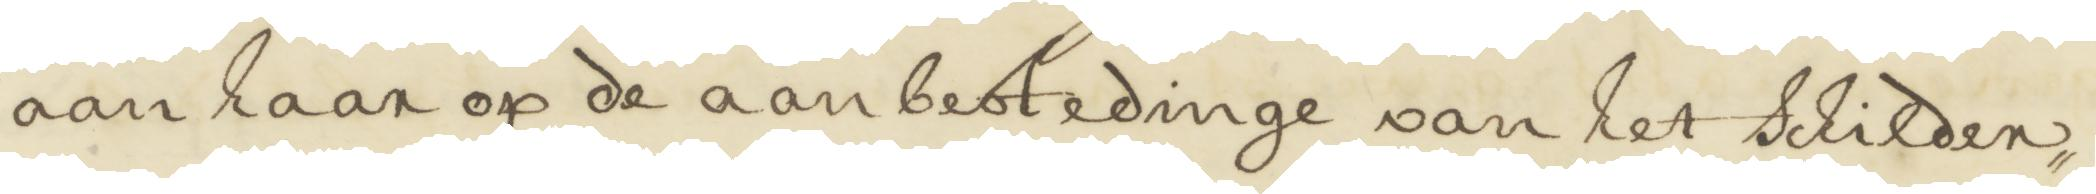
aan haar op de aanbestedinge van het schilder„
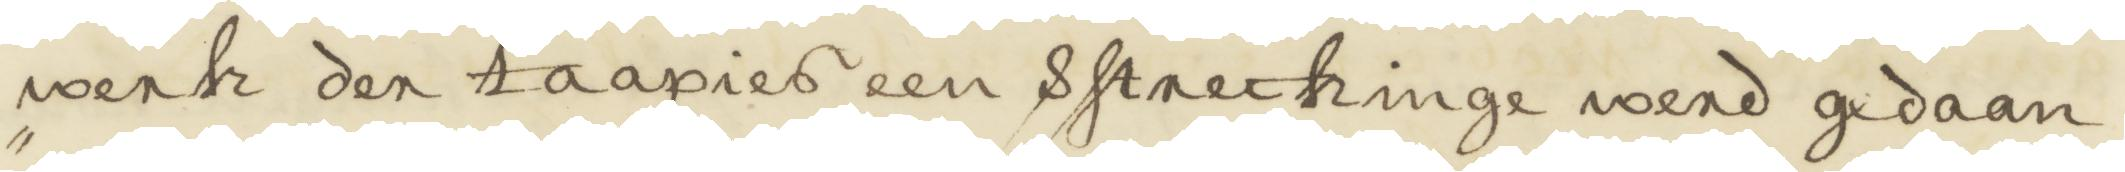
„werk der taapies, een verstreckinge werd gedaan
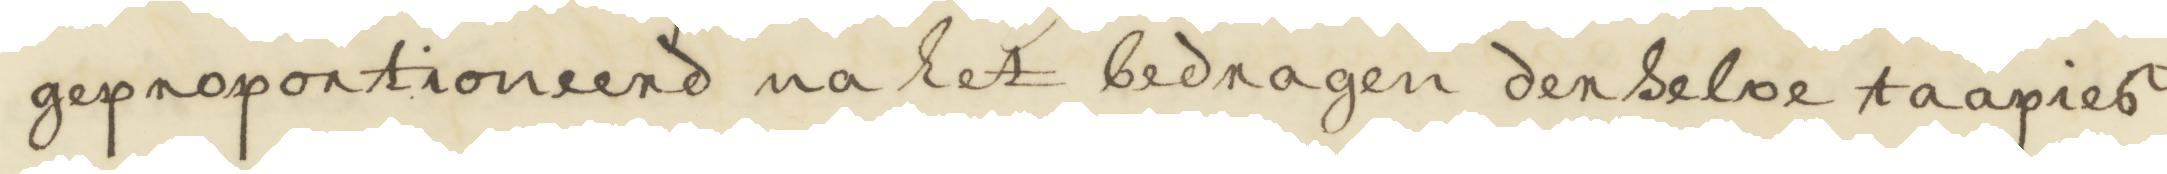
geproportioneerd na het bedragen derselve taapies
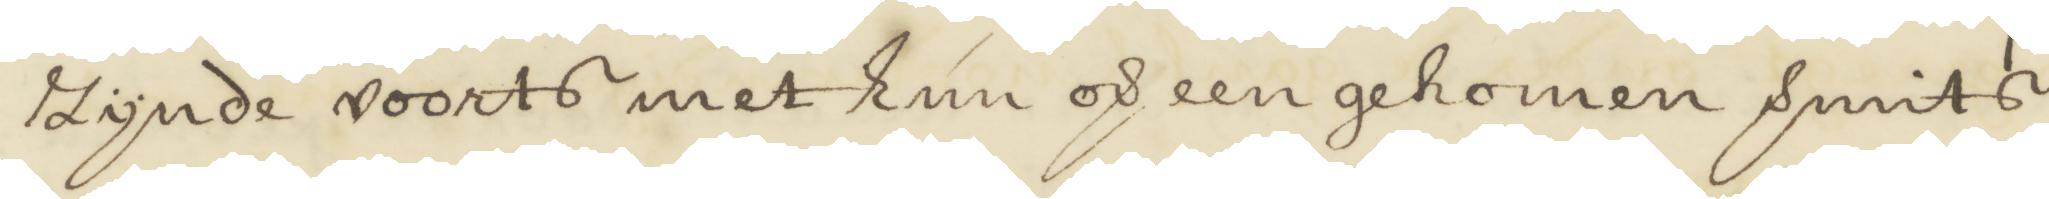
zijnde voorts met hun over een gekomen vermits
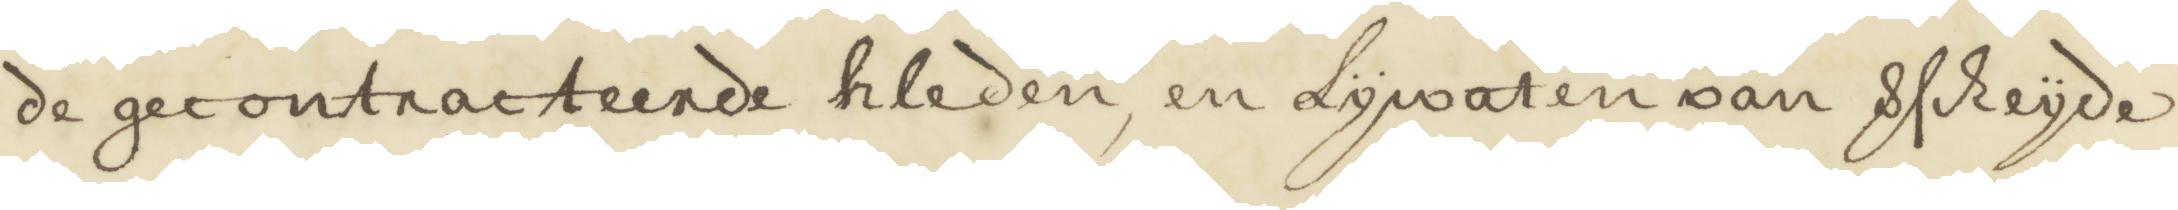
de gecontracteerde kleden, en Lijwaten van verscheijde
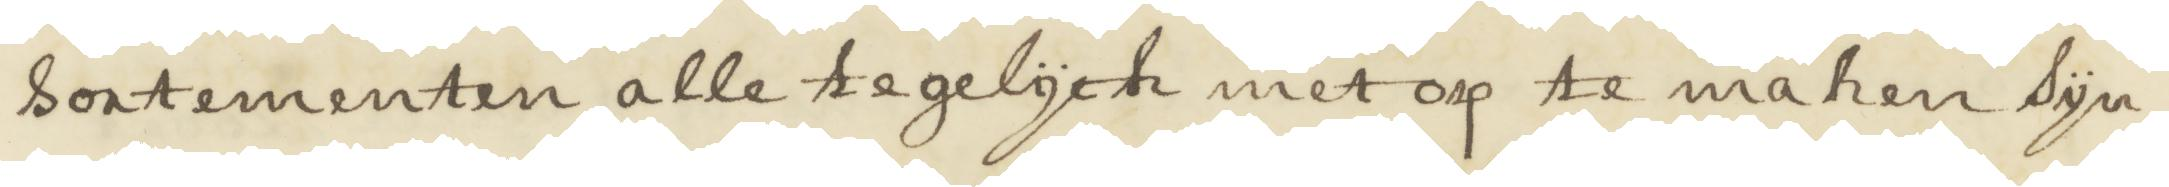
sortementen, alle tegelijck met op te maken sijn,
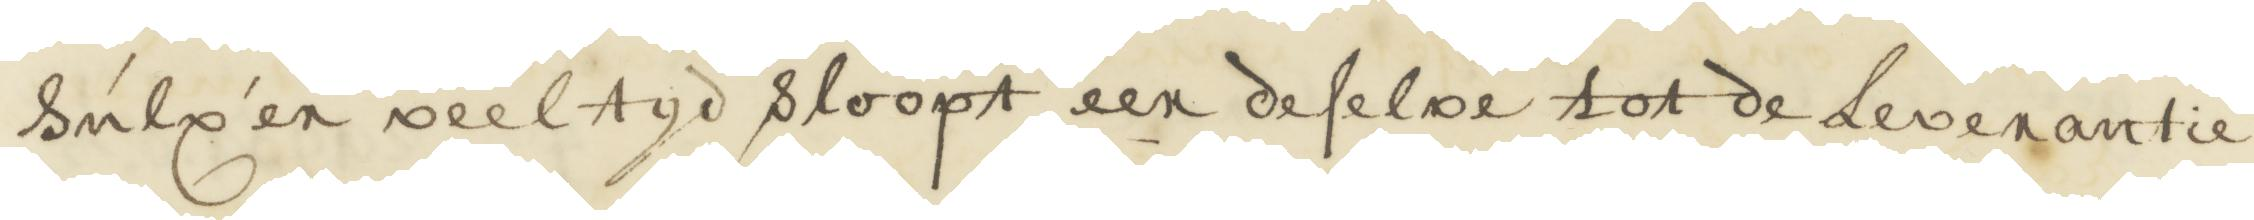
sulx'er veel tyd verloopt 'eer deselve tot de Leverantie
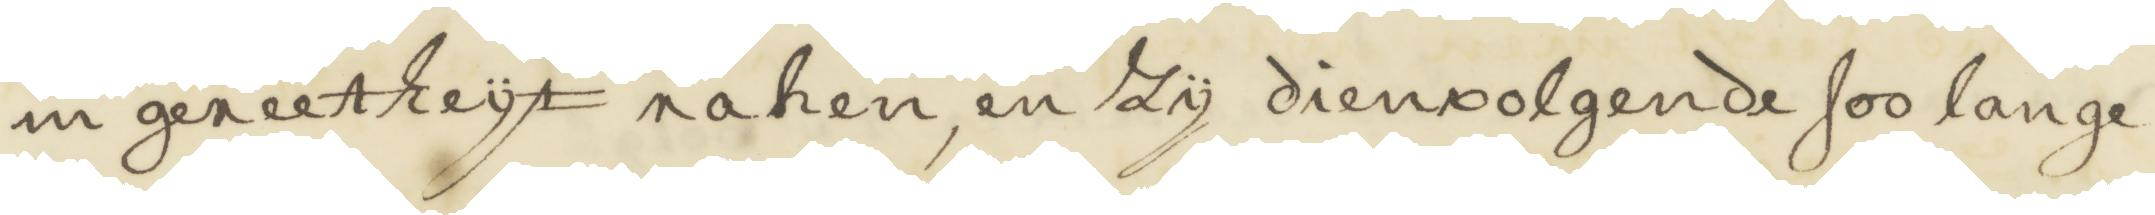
in gereetheijt raken, en zij dienvolgende soo lange
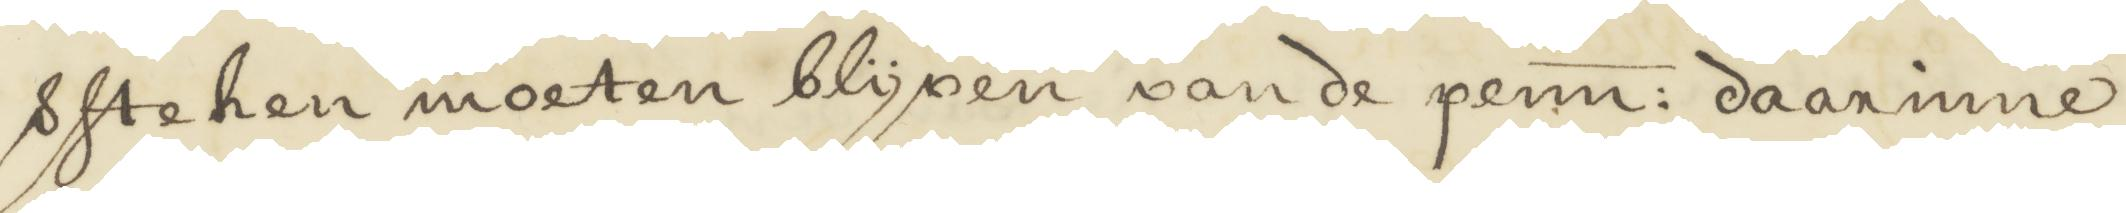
versteken moeten blijven, van de penn: daarinne
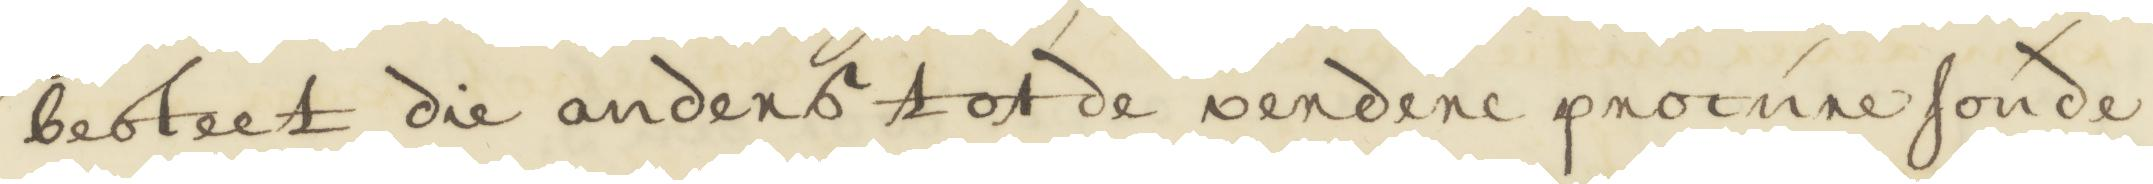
besteet, die anders tot de verdere procure soude
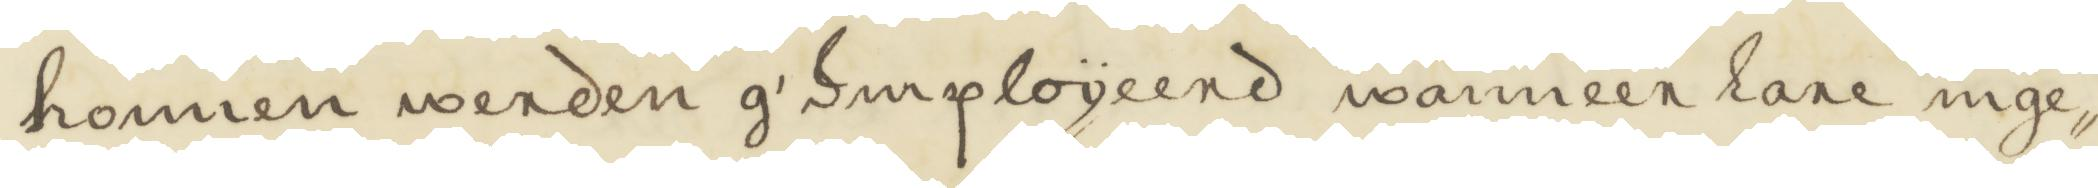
konnen werden g’Emploijeerd wanneer hare inge„
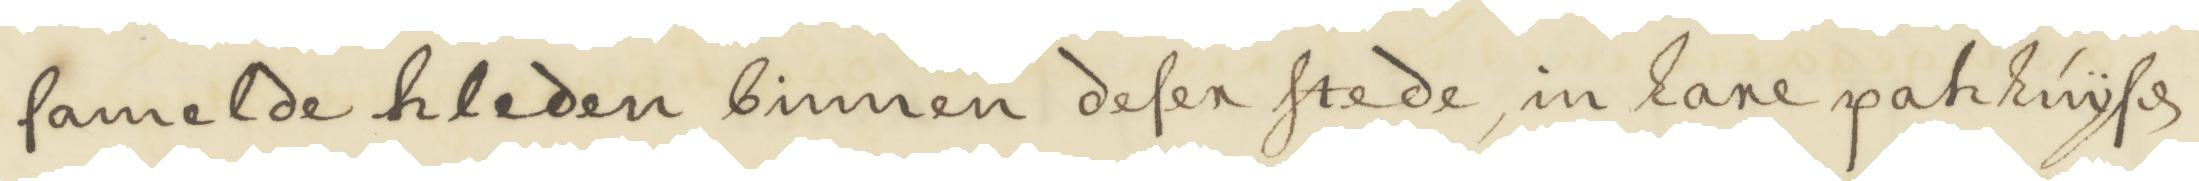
samelde kleden binnen deser stede, in hare pakhuijsen
